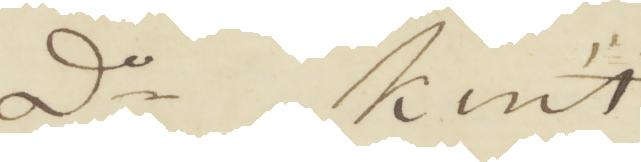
1 _=o kint
